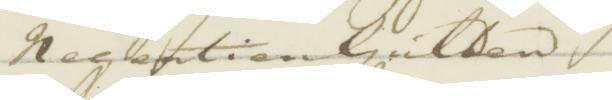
Negentien Gulden
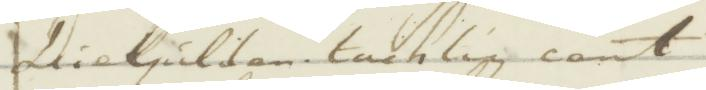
Drie Gulden tachtig cent
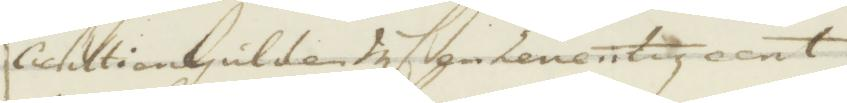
Achttien Gulden vijfen zeventig cent
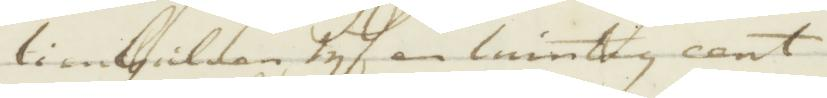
tien Gulden Vijf en twintig cent
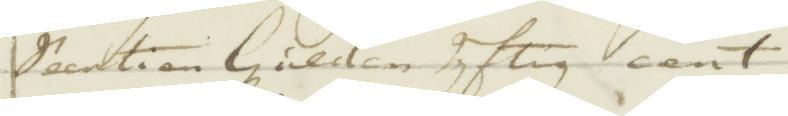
Veertien Gulden Vyftig cent
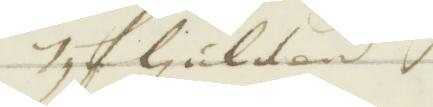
Vyf Gulden
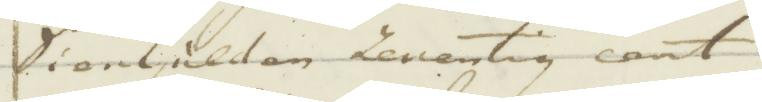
Tien Gulden zeventig cent
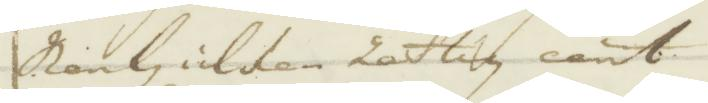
Drie Gulden zestig cent
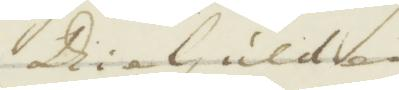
Drie Gulde
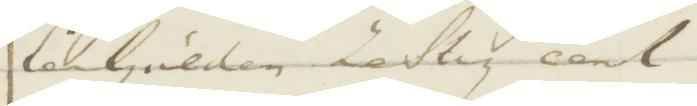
Een Gulden Zestig cent
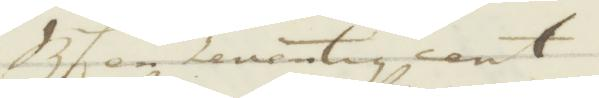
Vyf en zeventig cent
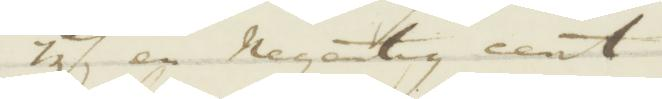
Vyk en negentig cent
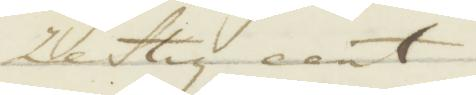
Zestig cent
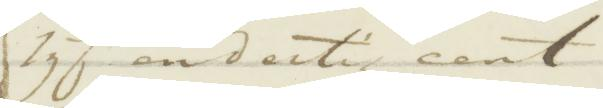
Vyf en dertig cent
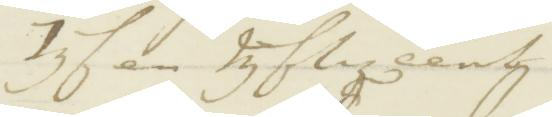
Vyf een Vyftig cents
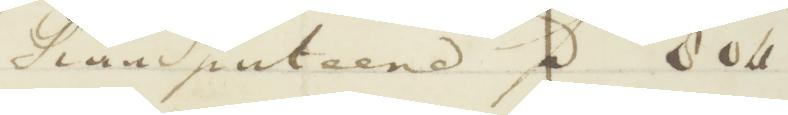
Transporteere 804
